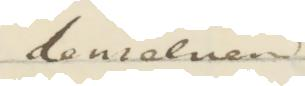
dencelven
